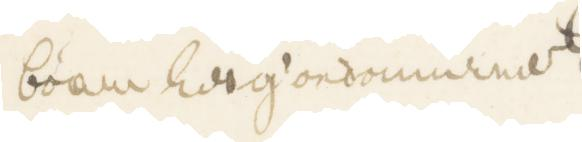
boven het g’ordonneerde
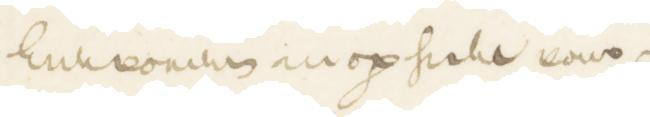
hiervoren in op sicht van
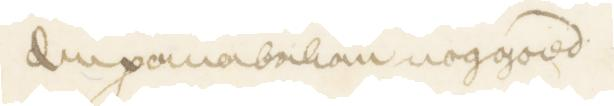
den panambahan nog goed
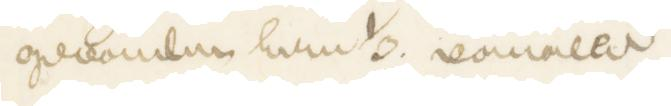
gevonden hem 1/3. vanalle
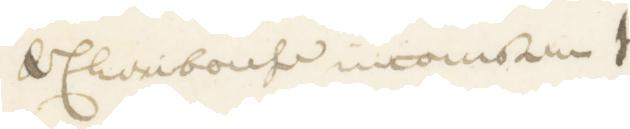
de cheribonse incomsten
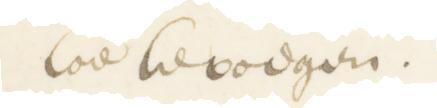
toe te voegen.
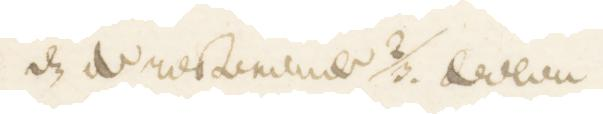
en de resterende 2/3. deelen
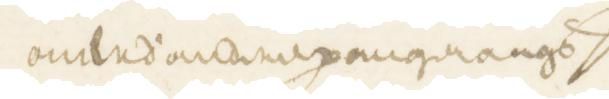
omtrd' andere pangerangs
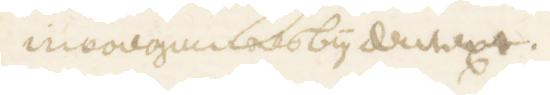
invoegen als bij den text.
